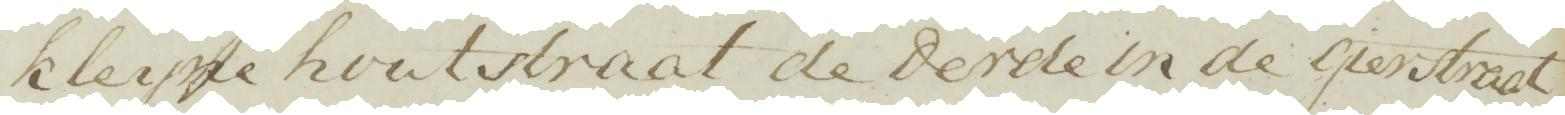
kleyne houtstraat, de derde in de gierstraat,
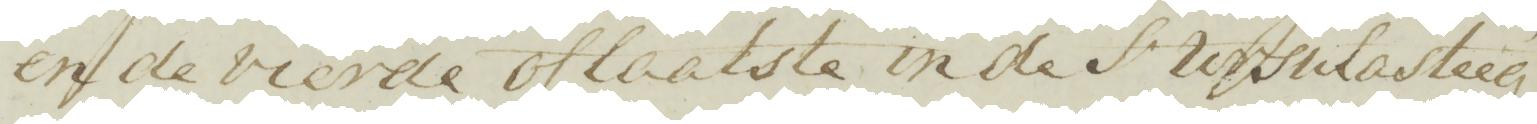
en de vierde of laatste in de S' Ursulasteeg
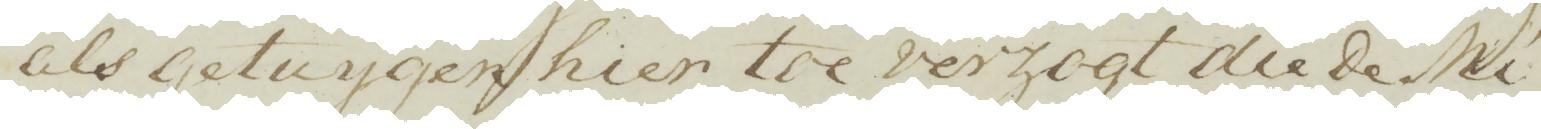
als getuygen hier toe verzogt die de Mi
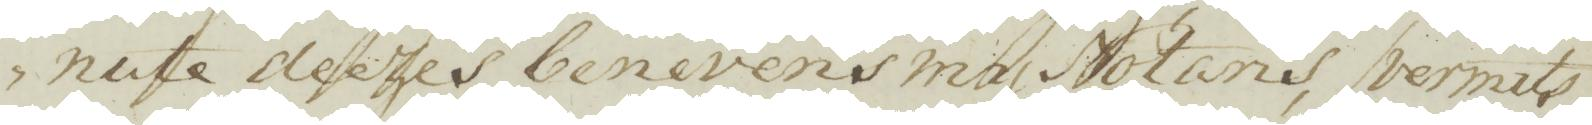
„nute deezes, benevens my Notaris, / vermits
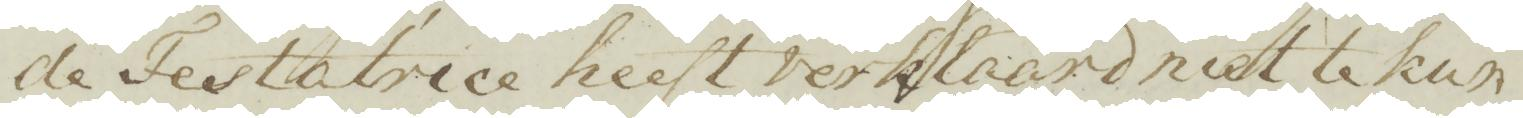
de Testatrice heeft verklaard niet te kun
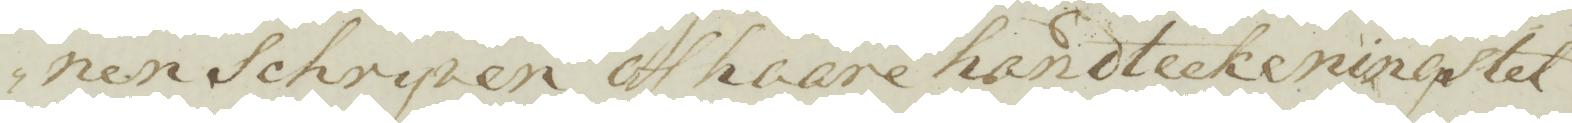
„nen schryven of haare handteekening stel
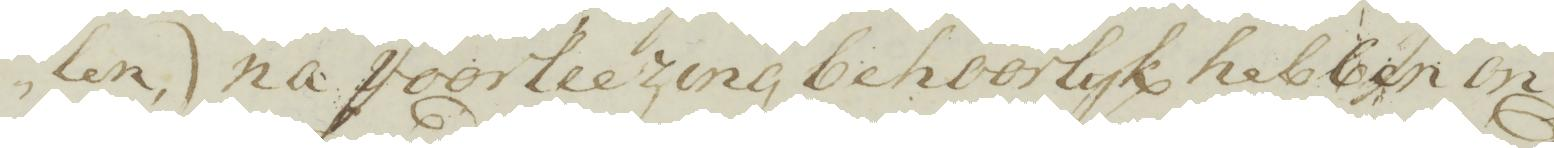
„len, na voorleezing behoorlyk hebben on
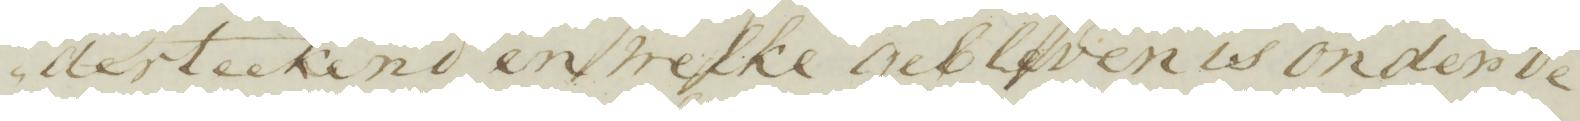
„derteekend, en welke gebleven is onder de
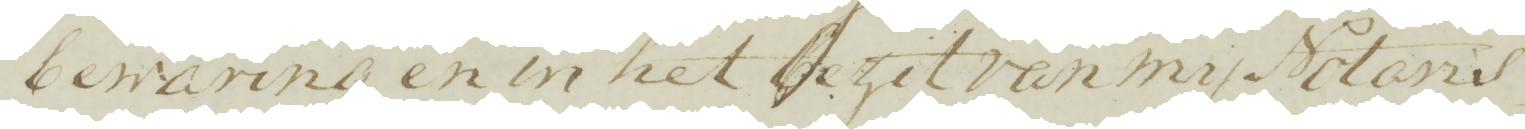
bewaring en in het bezit van my Notaris
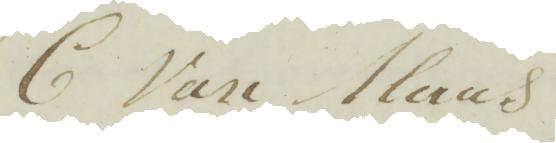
C Van Maas
